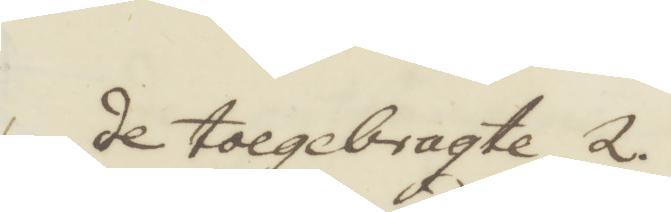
de toegebragte 2.
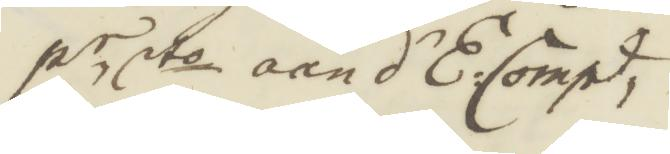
p,rc=to aan d’ E:Comp,e
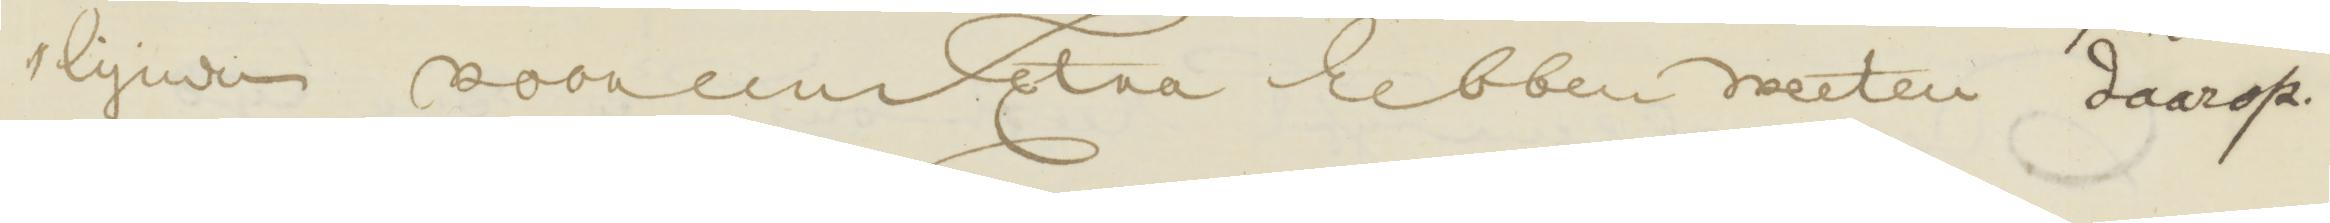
„lijnen voor een Extra hebben weeten daarop.
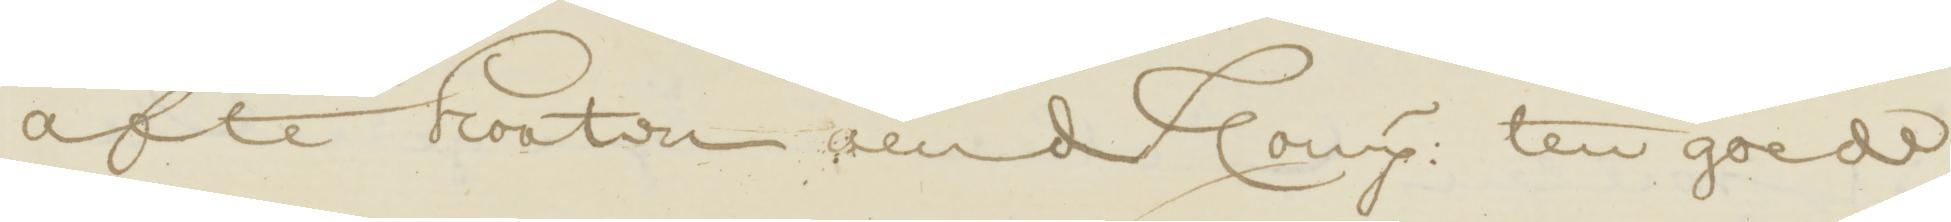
afte korten aen d'EComp: ten goede
